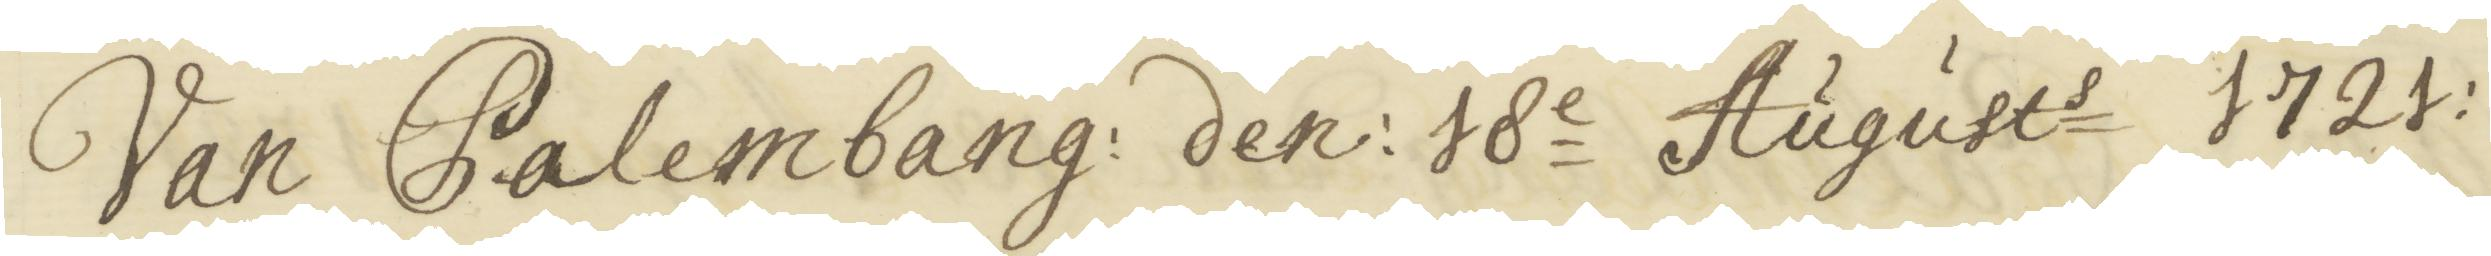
Van Palembang: den: 18=e August=s 1721:
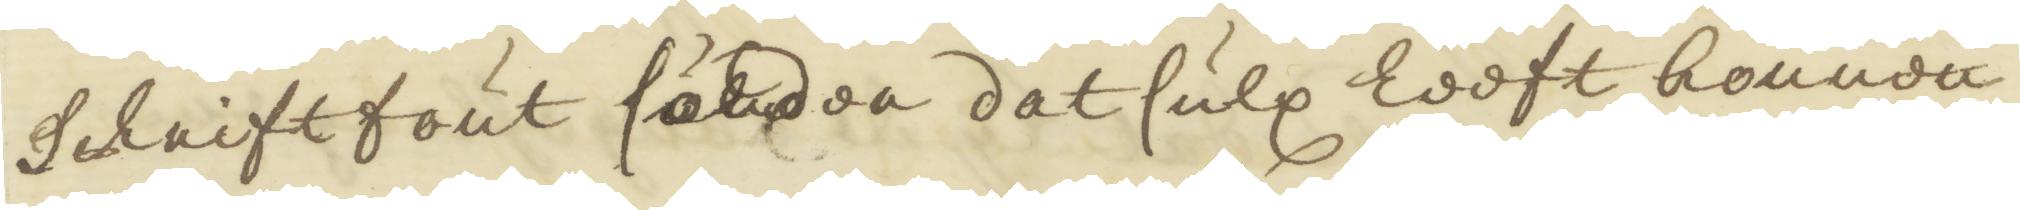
schriftfout sonder dat sulx heeft konnen
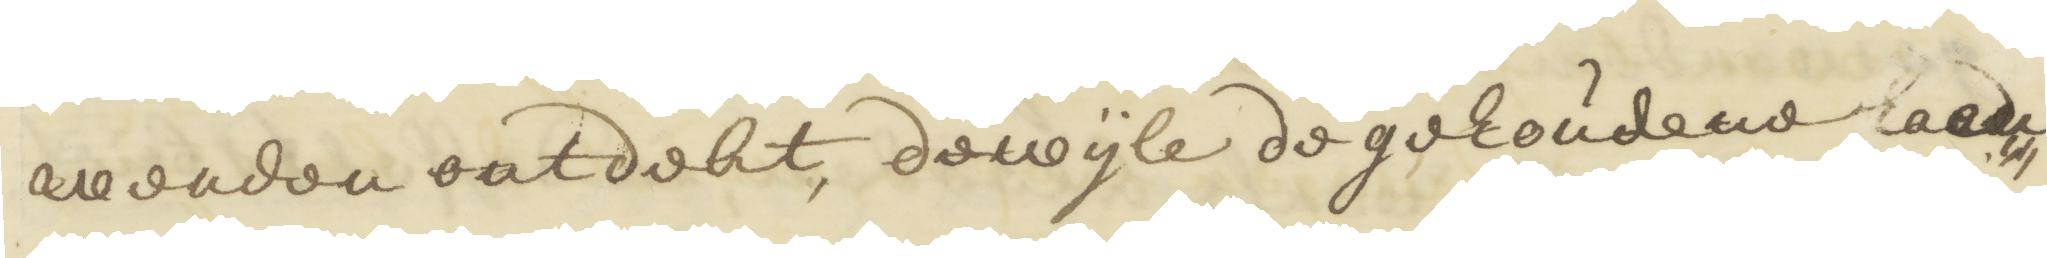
werden ontdekt, dewijle de gehoudene haad„
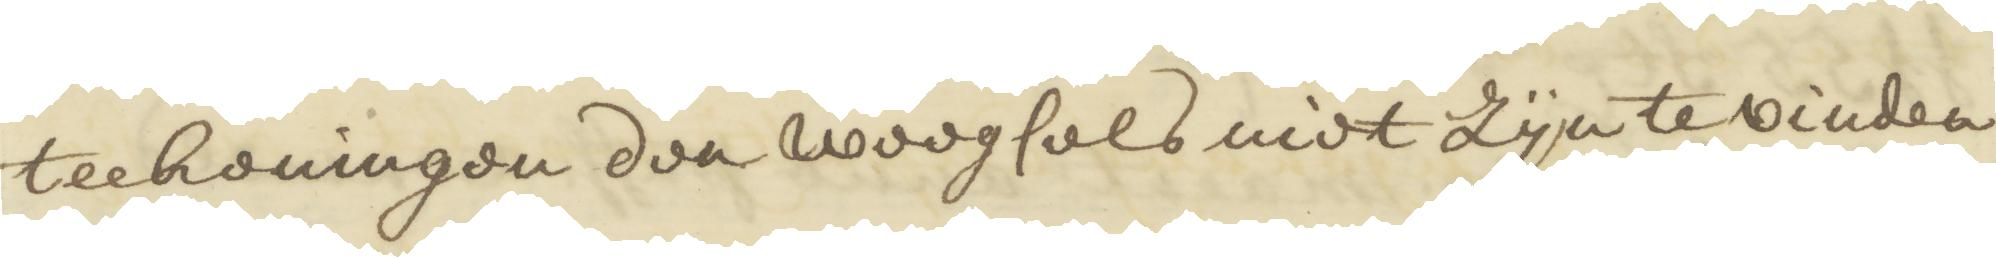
teekeningen der weegsels niet zijn te vinden
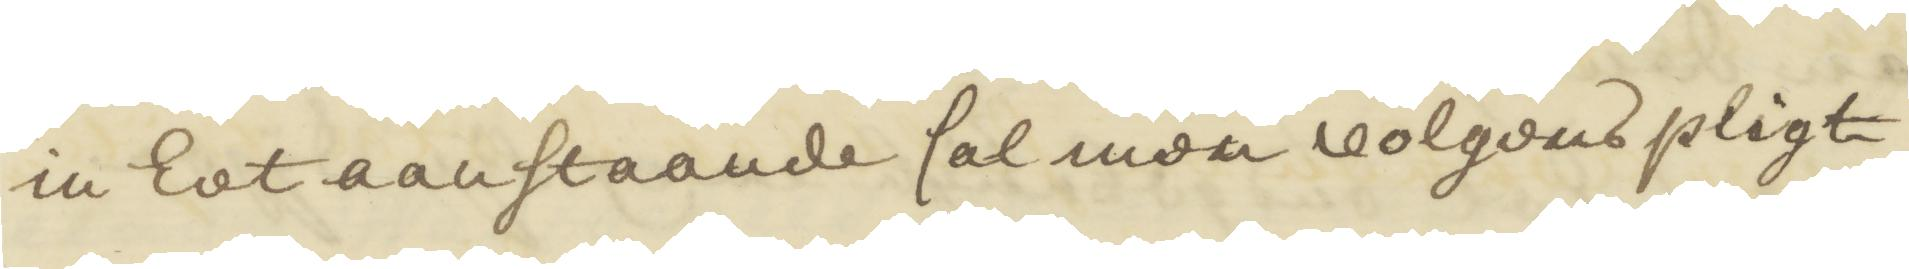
in het aanstaande sal men volgens pligt
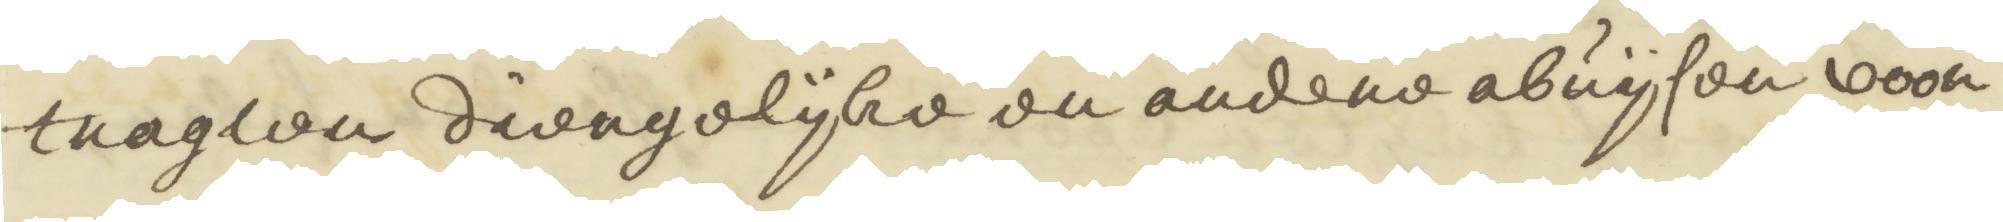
tragten diergelijke en andere abuijsen voor
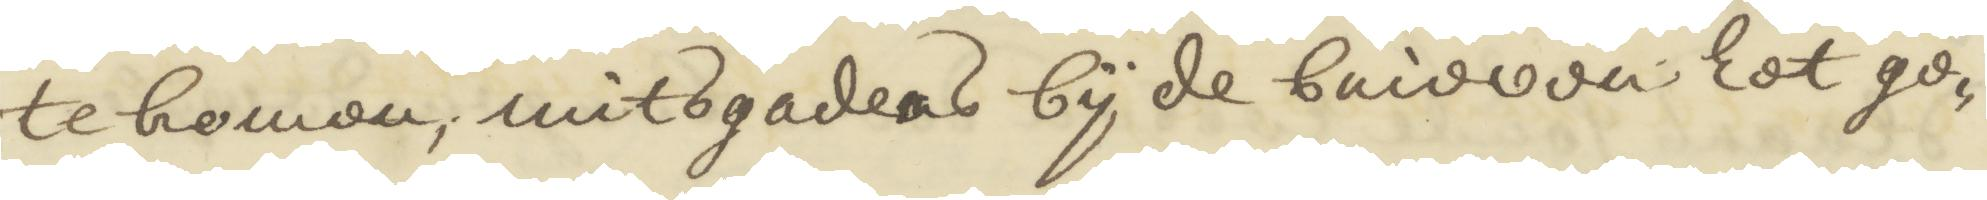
te komen, mitsgaders bij de brieven het ge„
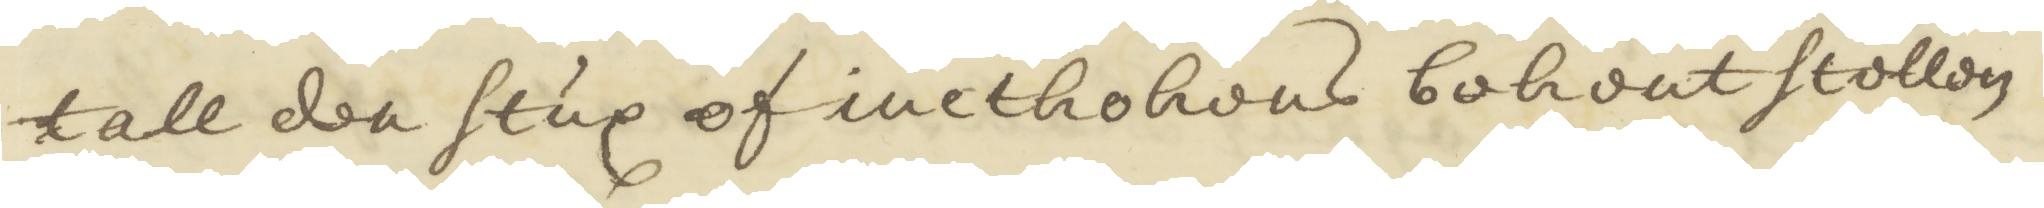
tall der stux of inctkokers bekent stellen
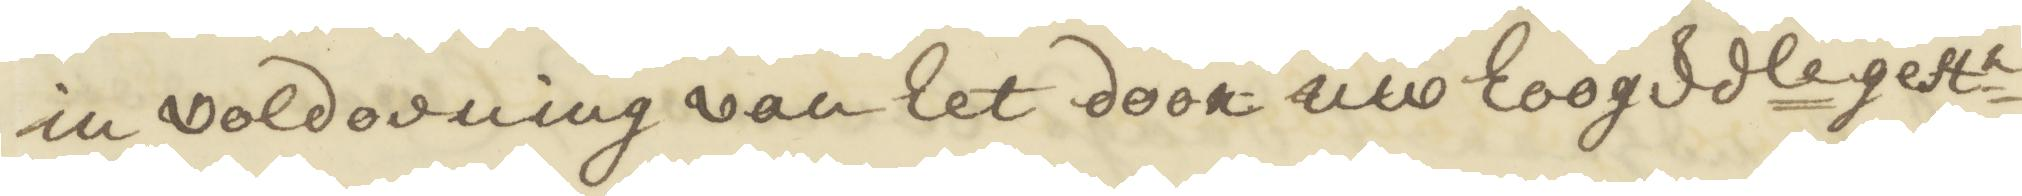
in voldoening van het door uw hoog Ed=le gest=r
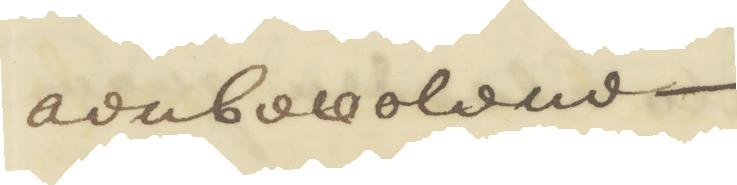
aenbevolene
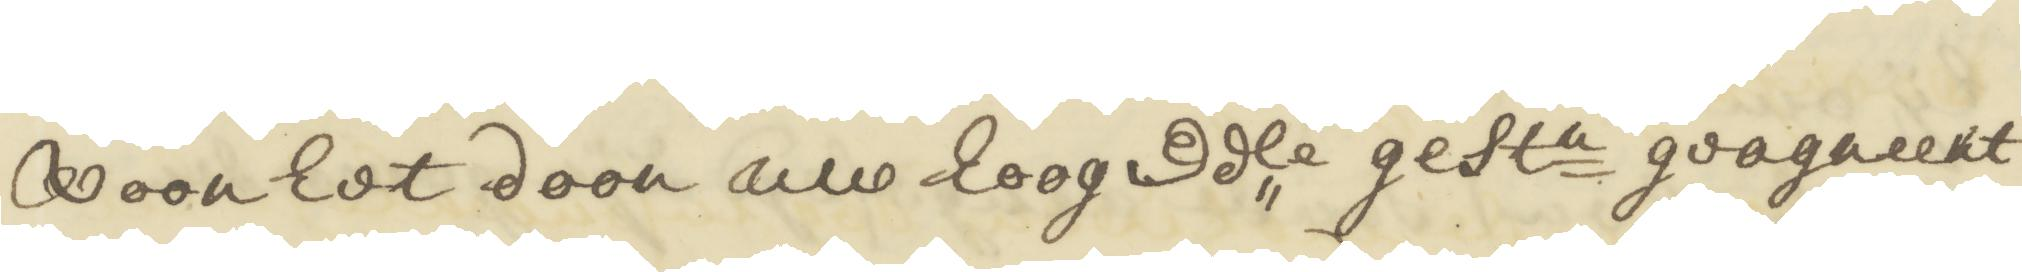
Voor het door uw hoog Ed„le gest=r geagreert
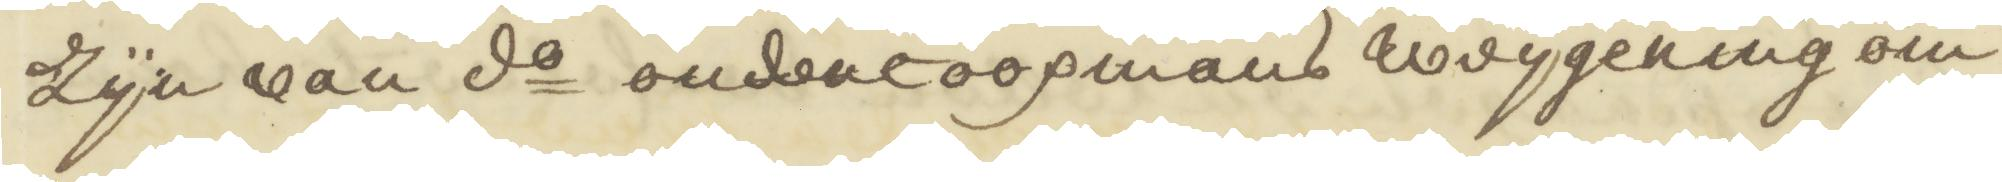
zijn van d=o ondercoopmans weijgering om
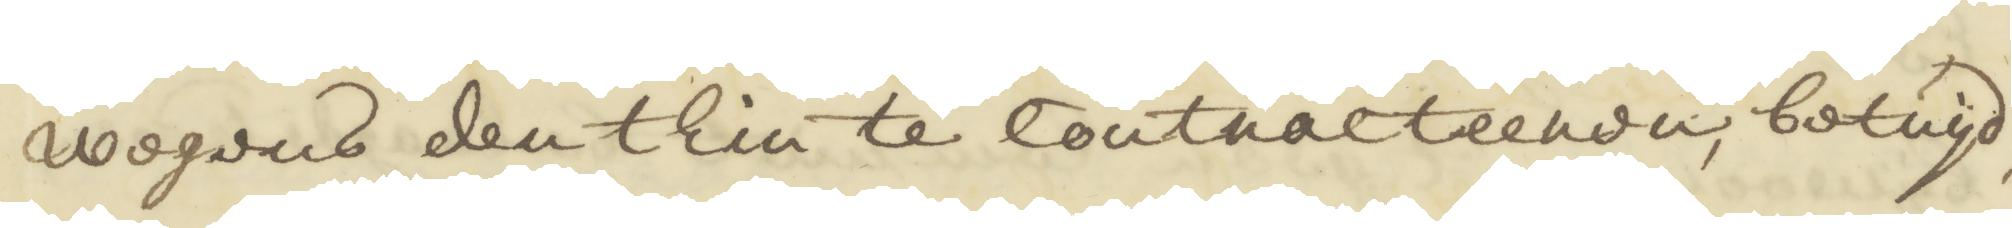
wegens den thin te contracteeren, betuijd
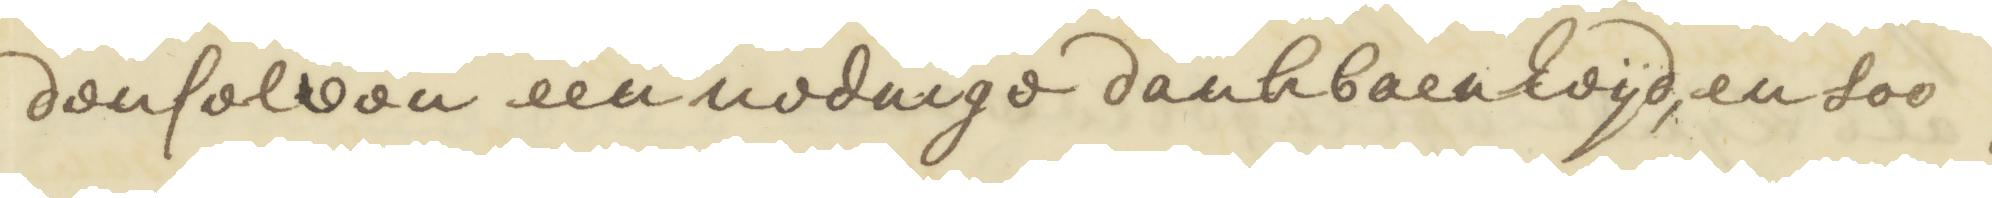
denselven een nedrige dankbaerheijd, en soo
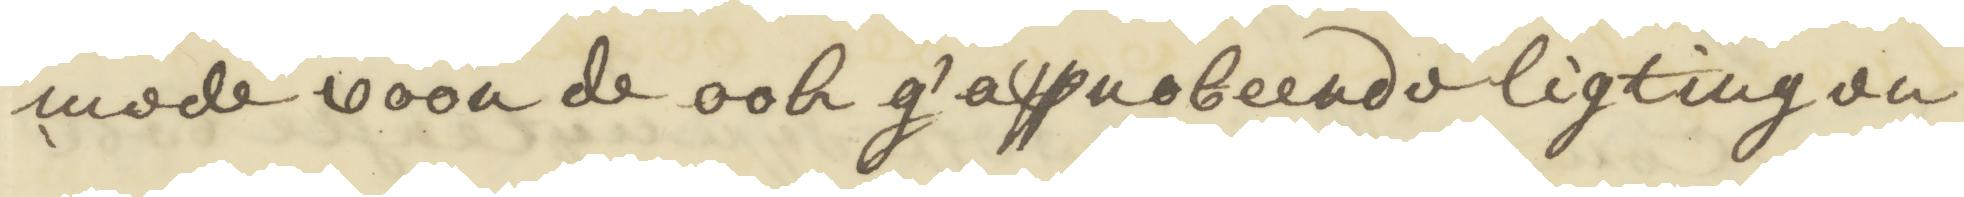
mede voor de ook g’approbeerde ligting en
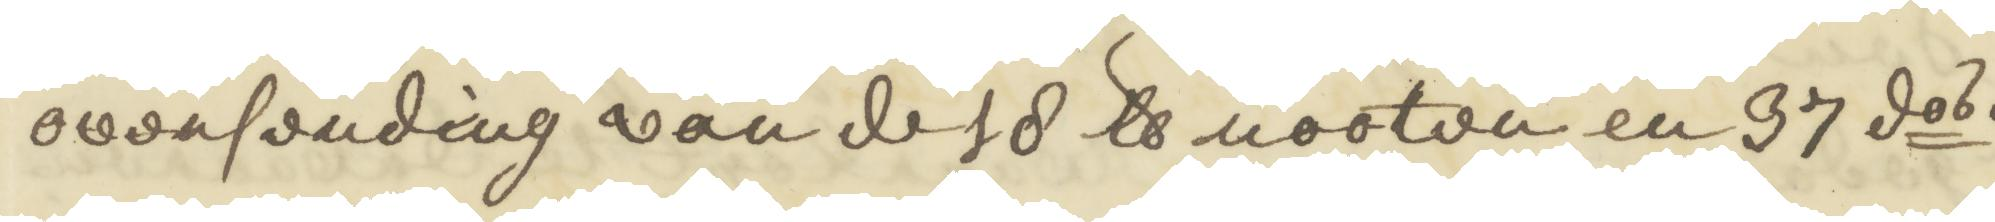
oversending van de 18 lb nooten en 37 d=os
